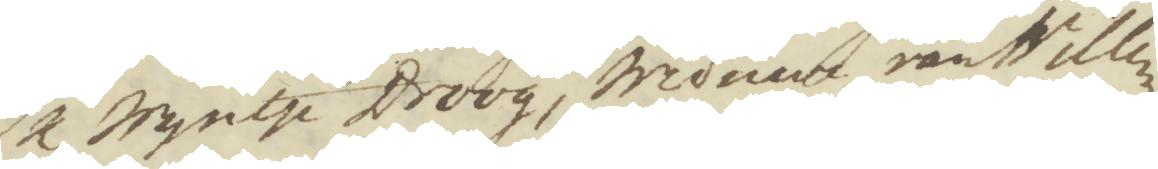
Ik Wyntje Droog, weduwe van Willem
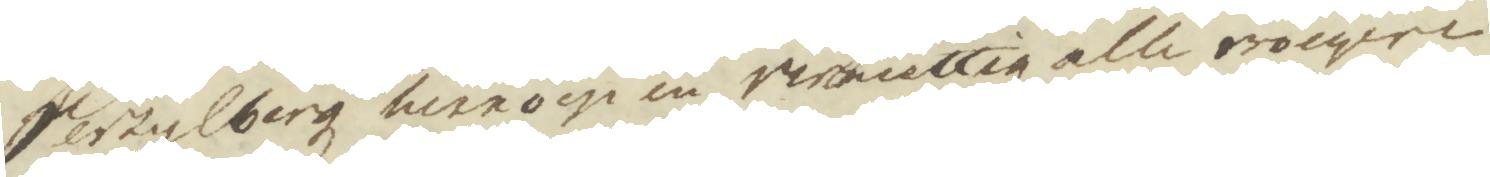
Verzylberg herroep en verniettig alle vroegere
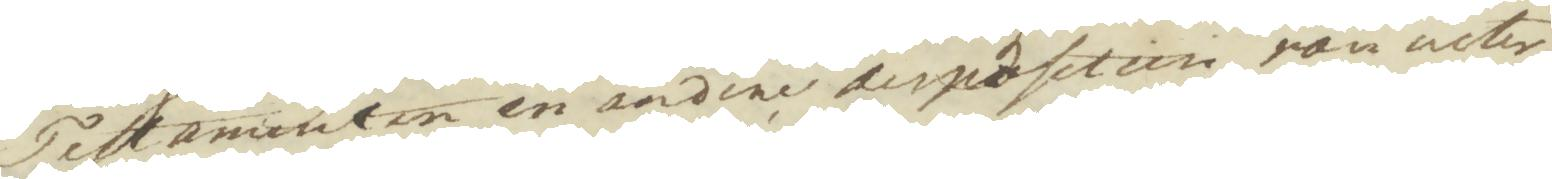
Testamenten en andere dispositien van uiter
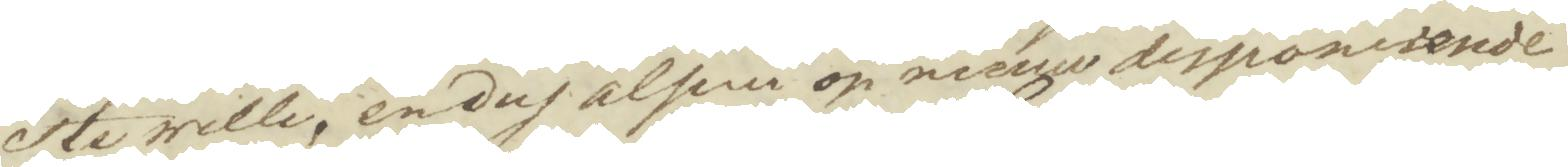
ste wille, en dus alsnu op nieuw disponerende
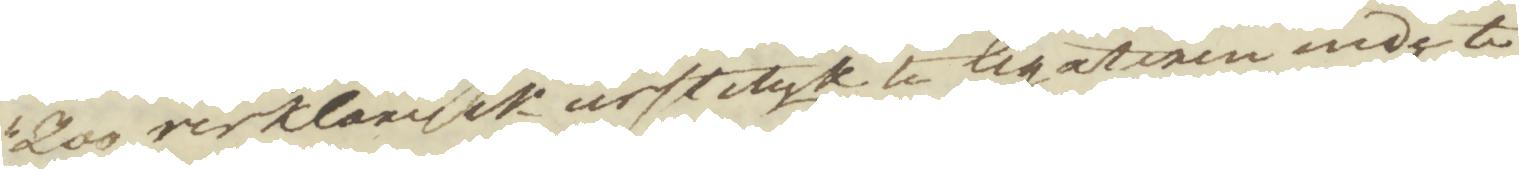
zoo verklare ik eerstelyk te legateren ende te
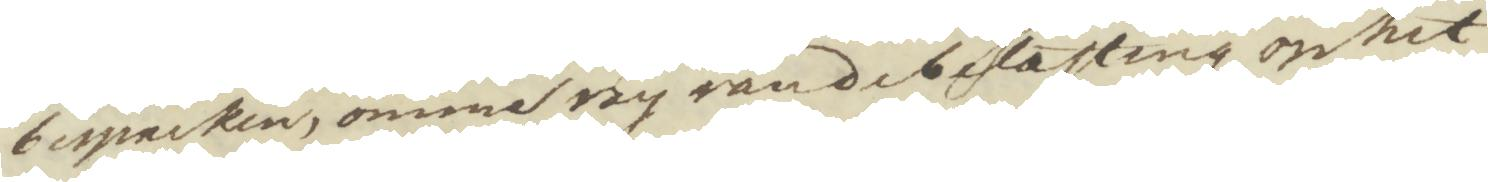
bespreken, omme vry van de belasting op het
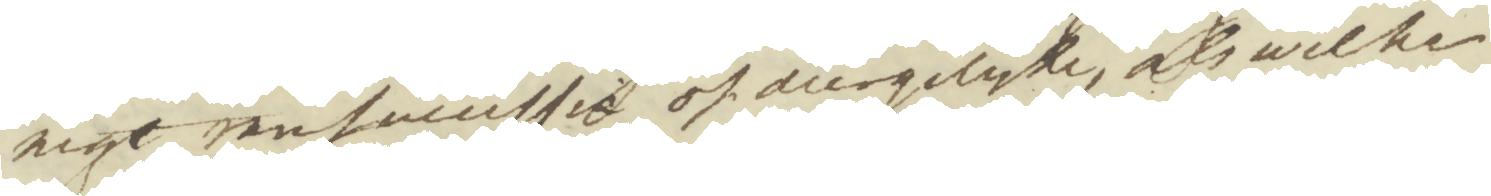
regt van successie of diergelyke, als welke
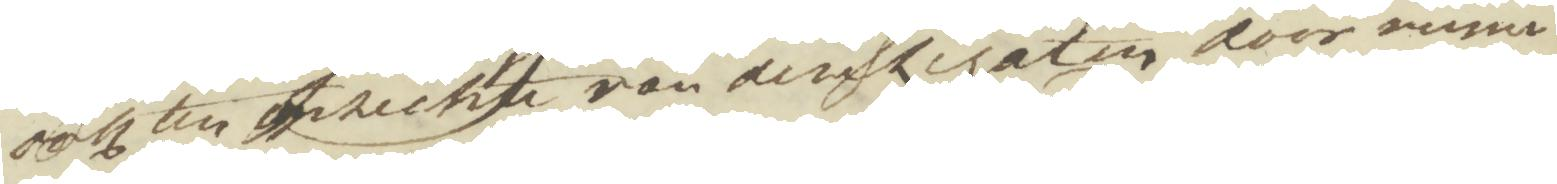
ook ten opzichte van deze legaten door myne
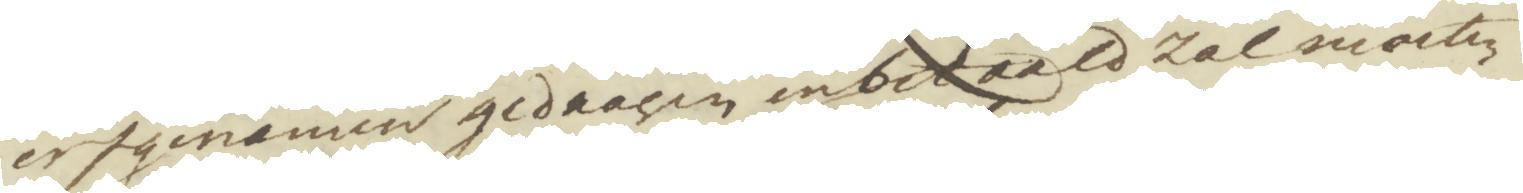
erfgenamen gedragen en betaald zal moeten
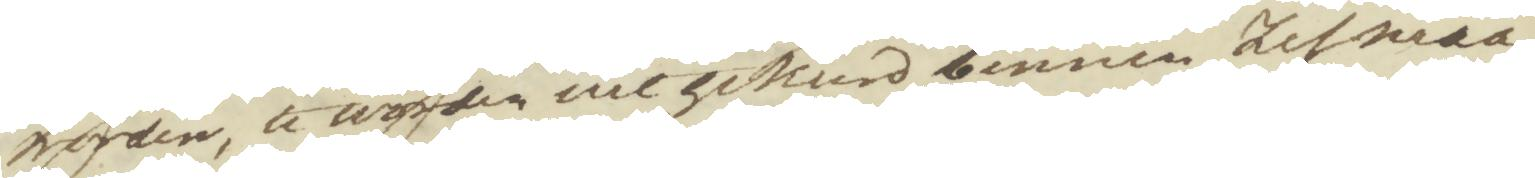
worden, te worden uitgekeerd binnen zes maan
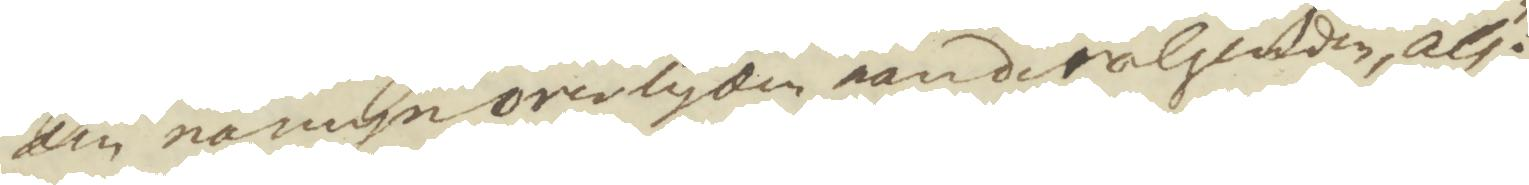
den na myn overlyden aan de volgenden, als;
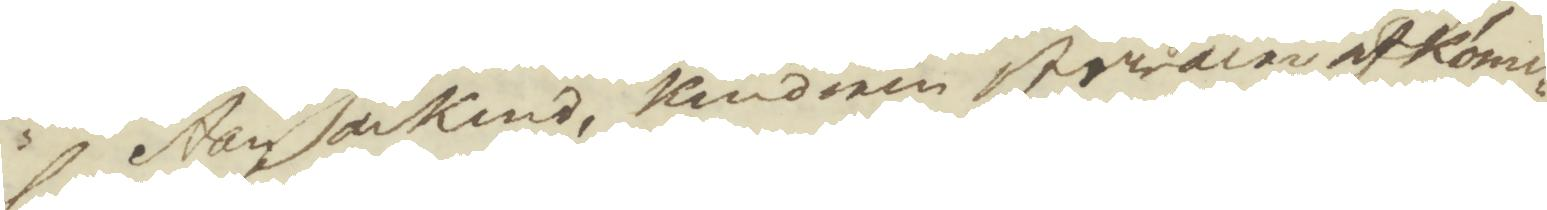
Aan de kind, kinderen of verdere afkome„
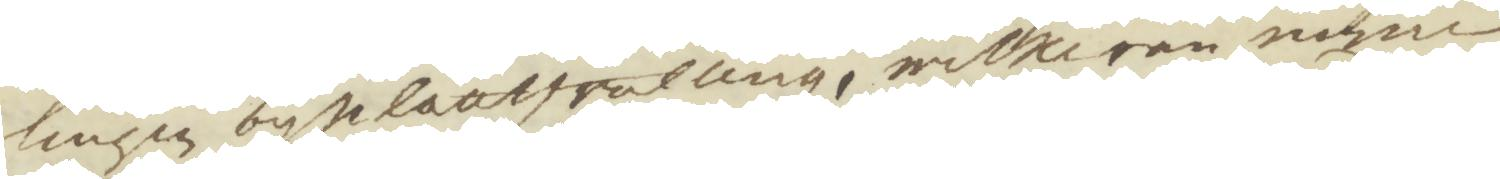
lingen by plaatsvulling, welke van myne
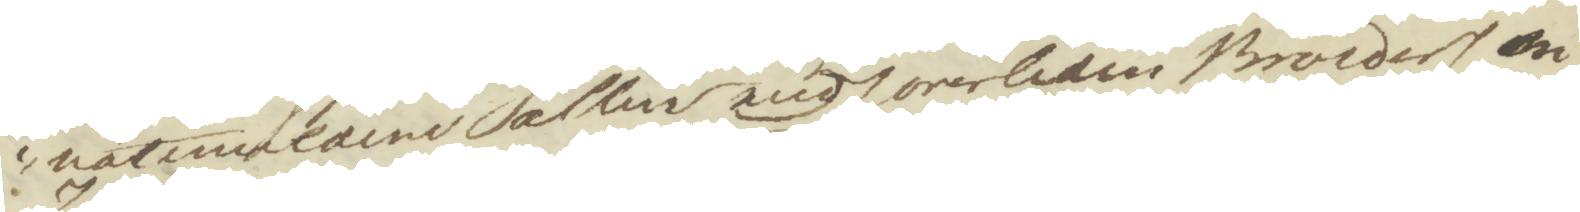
„natemeldene allen reeds overleden Broeders en
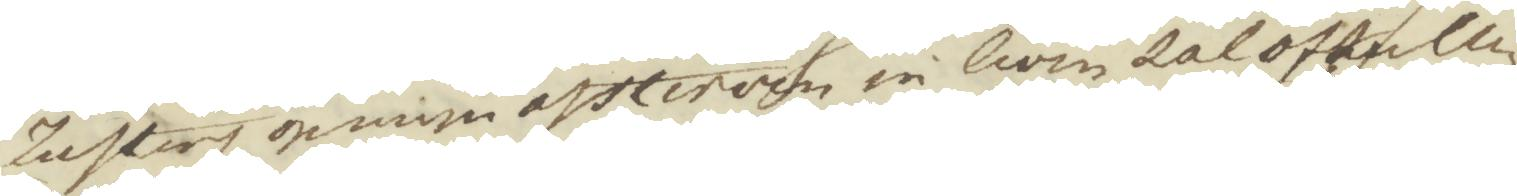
zusters op myn afsterven en leven zal of zullen
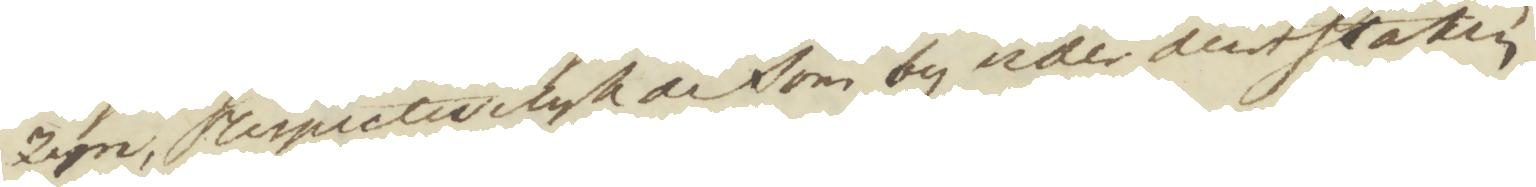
zyn, respectivelyk de som by ieder der tstaten
